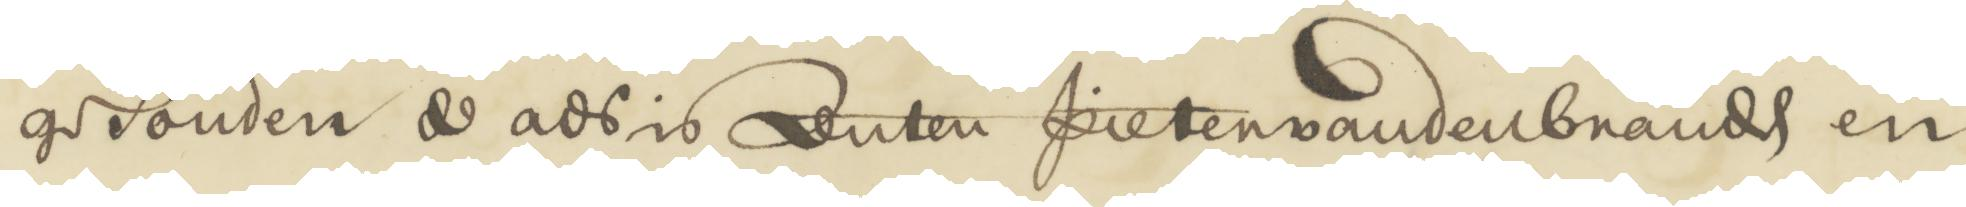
gesonden de adsistenten pieter vanden branden en
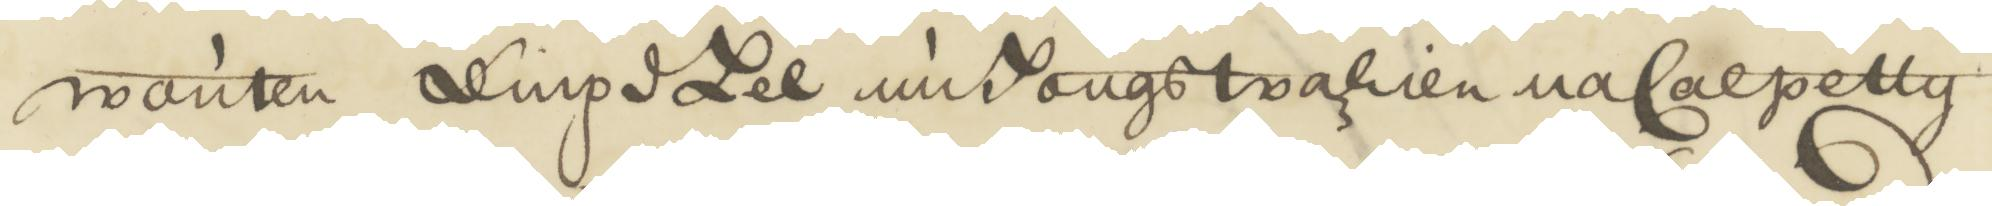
wouter tenpezel nu Iongst van hier na Calpetty
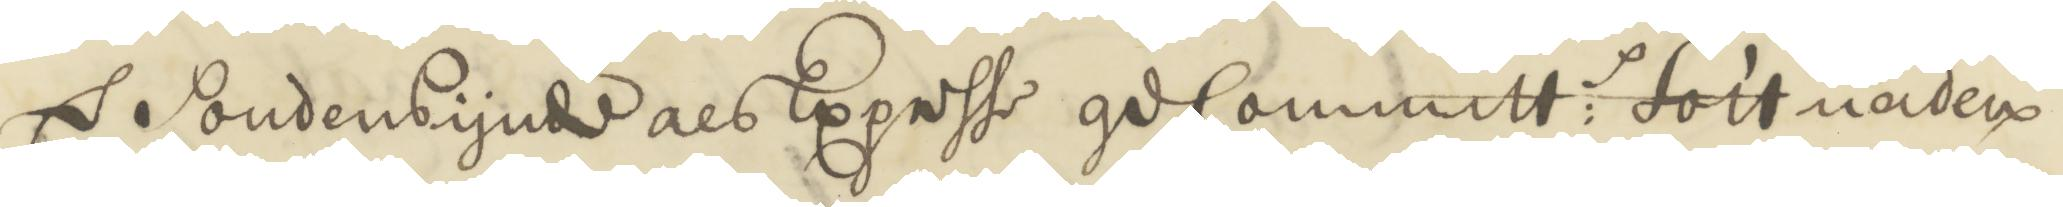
versonden sijnde als Expresse gecommitt:s tot 't nader
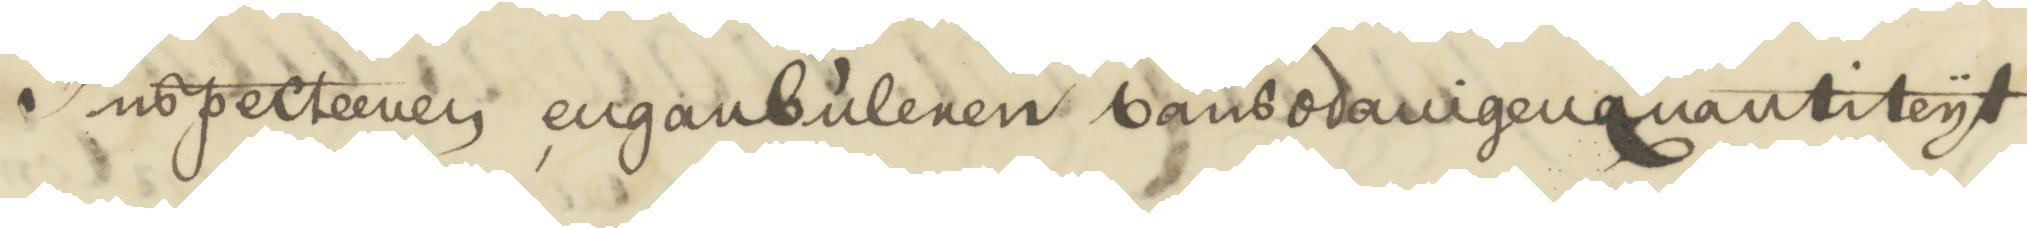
Inspecteeren en garbuleren van sodanigen quantiteijt
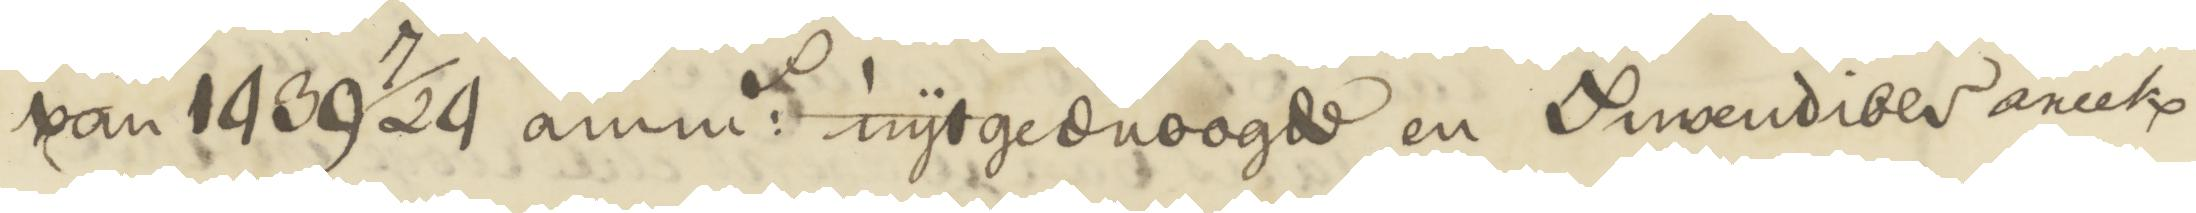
van 1439 7/24 amm:s uijtgedroogde en Invendible areek
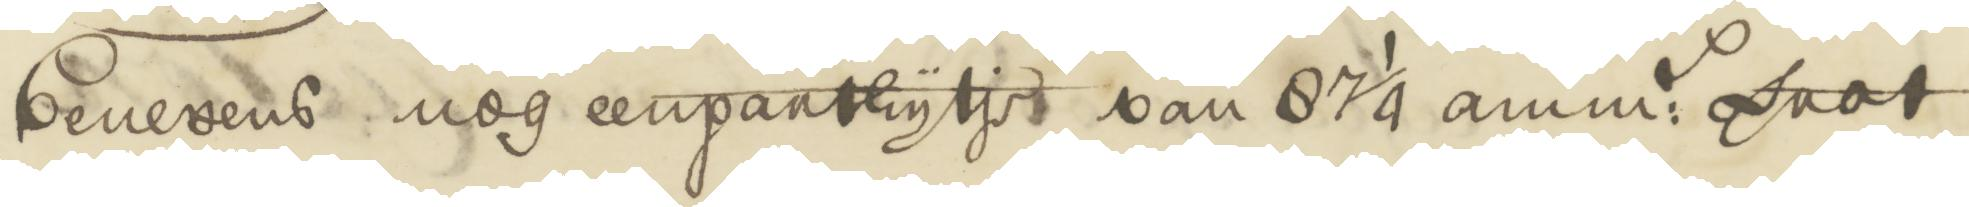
benevens nog een parthijtje van 87¼ amm:s verrot
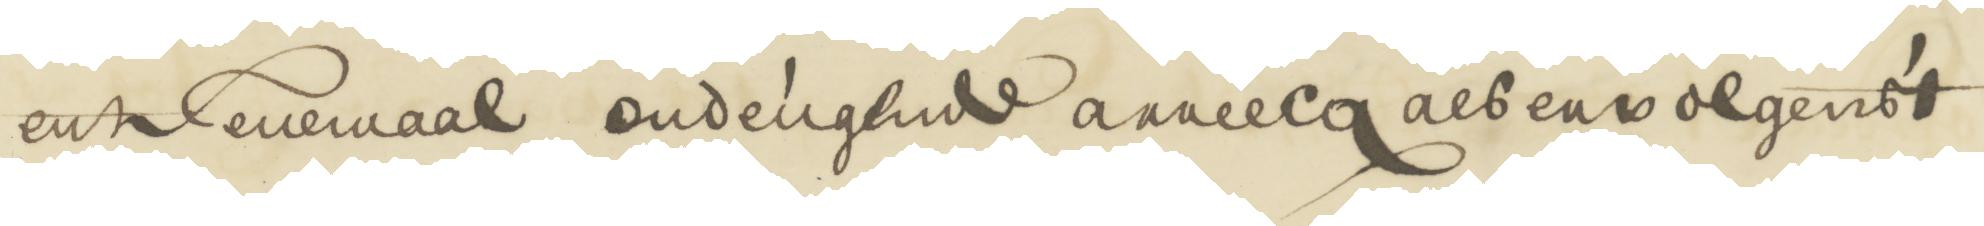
en t Eenemaal ondeugende arreecq als er volgens't
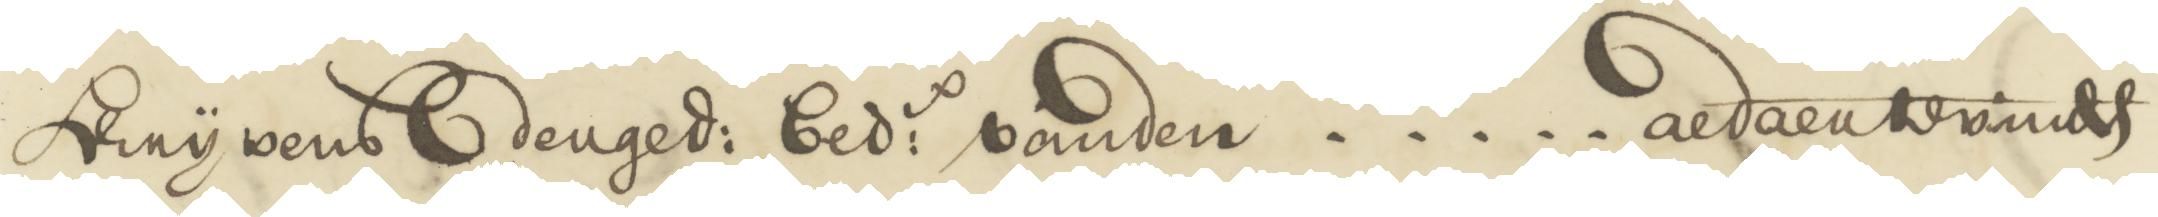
schrijvens der ged: bed:s vanden . . . . . aldaer te vinden
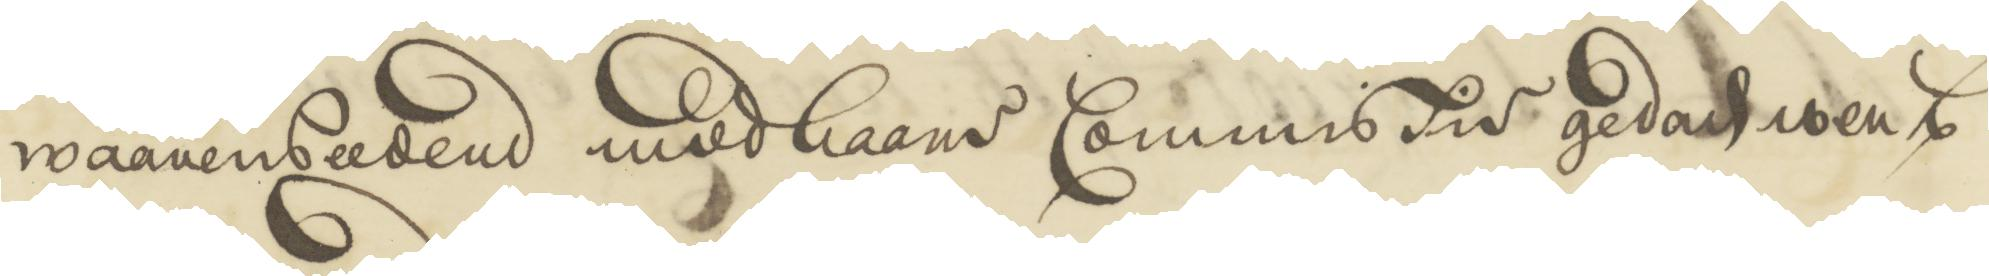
waaren seederd med haare Commissie gedaen werk
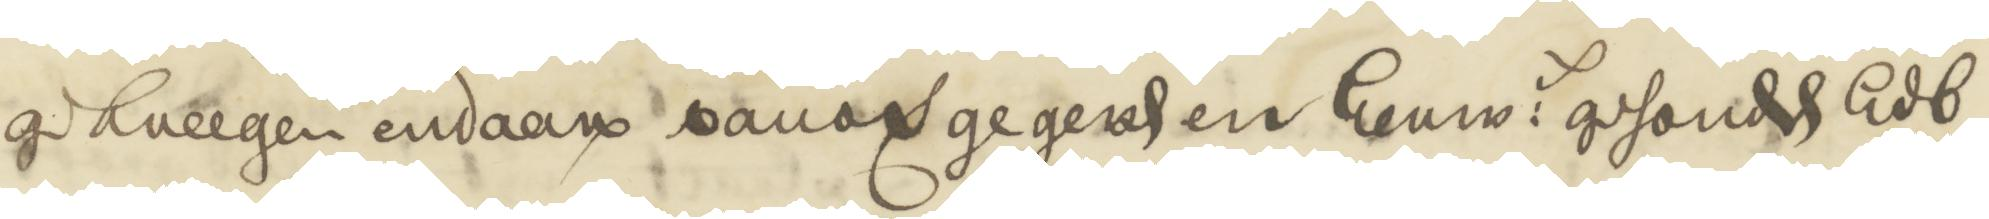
gekreegen en daar van overgegeven en herw:s gesonden heb
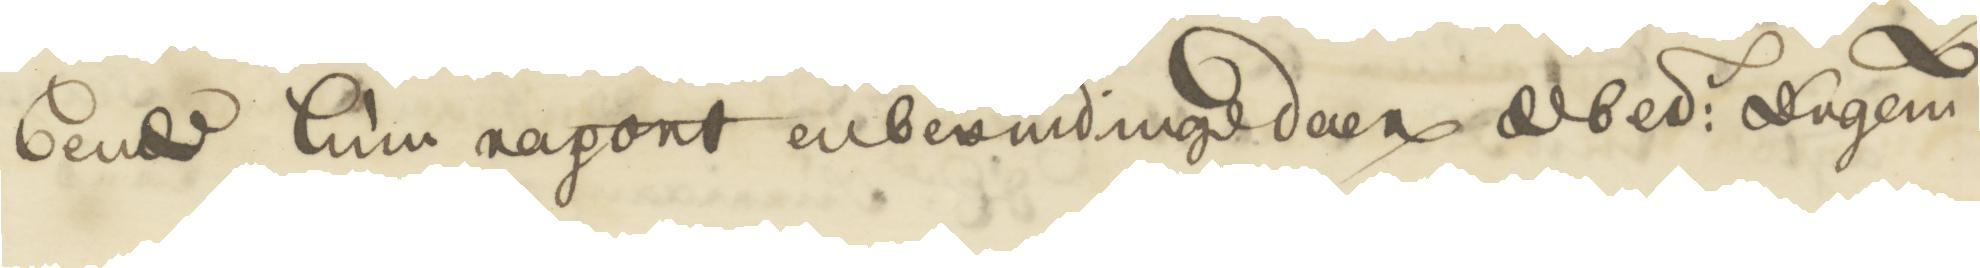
bende hun raport en bevindinge daer de bed:s tergem:
